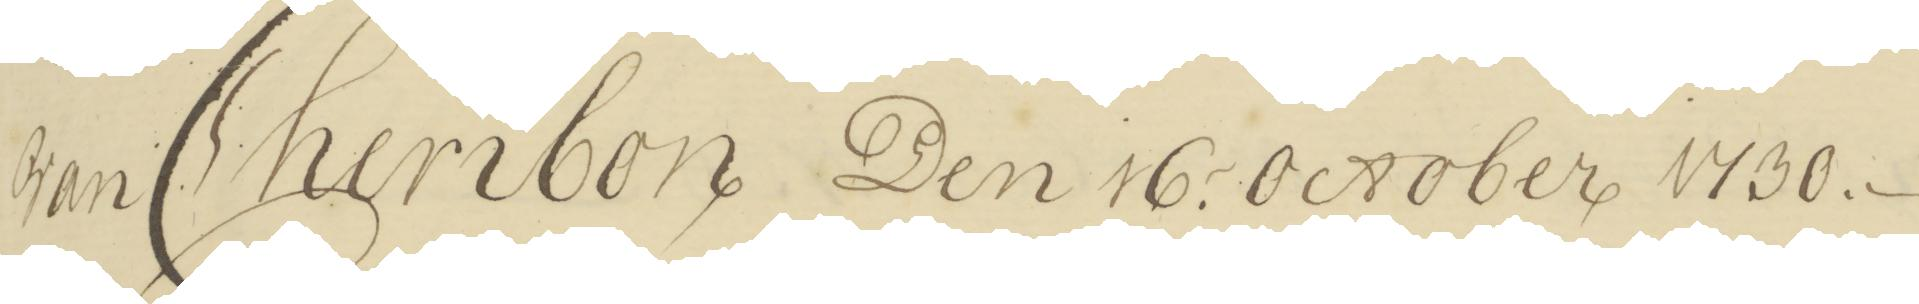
Van Cheribon Den 16.' October 1730. —
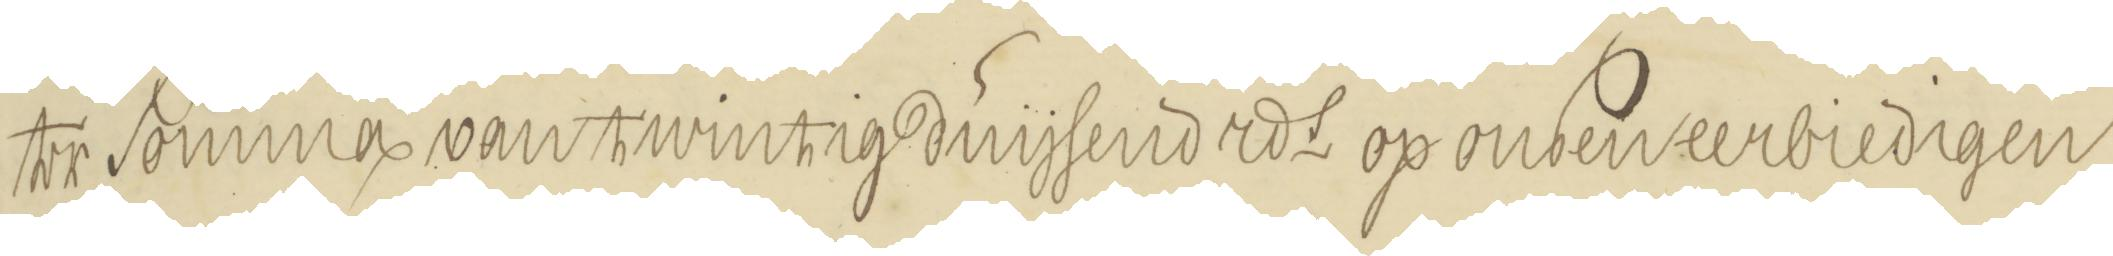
ter somma van twintig duijsend rd-s op onsen eerbiedigen
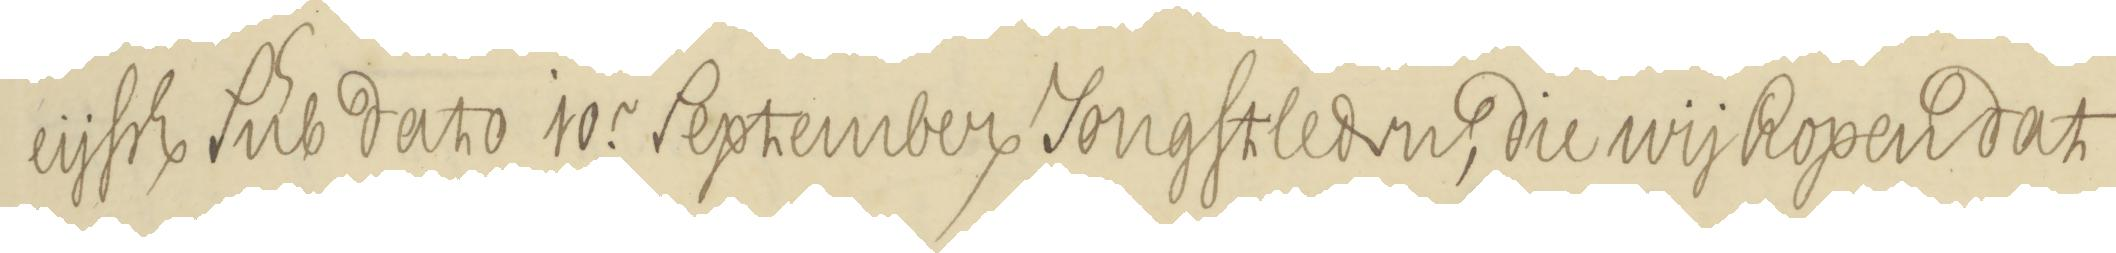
eijsch sub dato 10.' September Iongstleden, die wij hopen dat
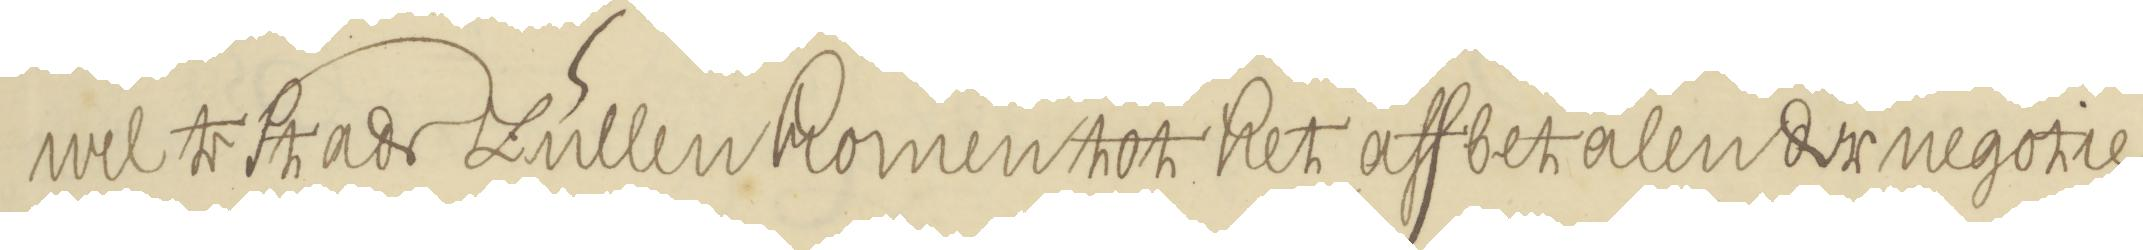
wel te stade zullen komen tot het affbetalen der negotie
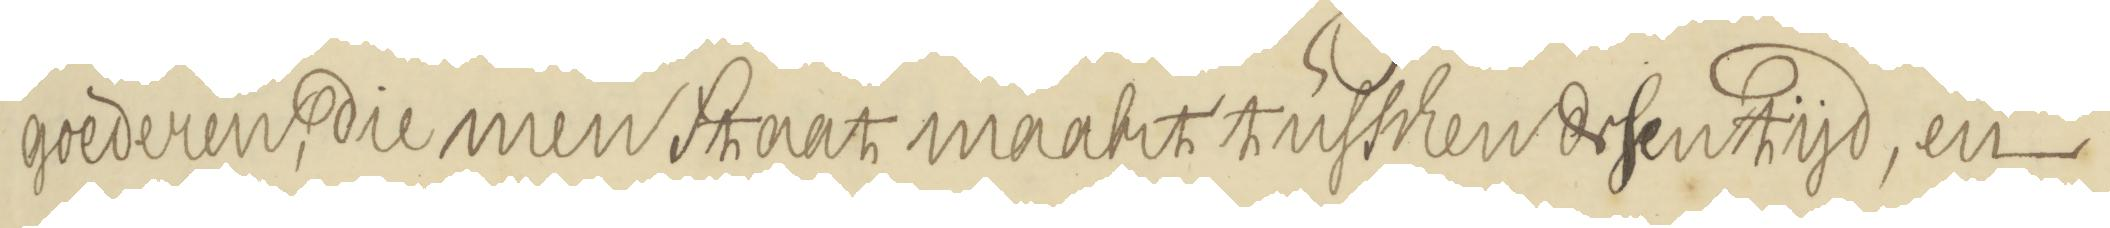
goederen, die men staat maakt tusschen desen tijd, en
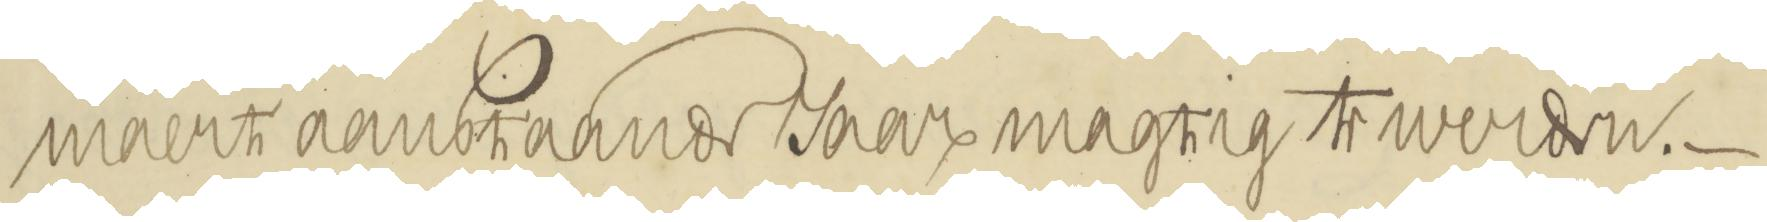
maert aanstaande Iaar magtig te werden. —
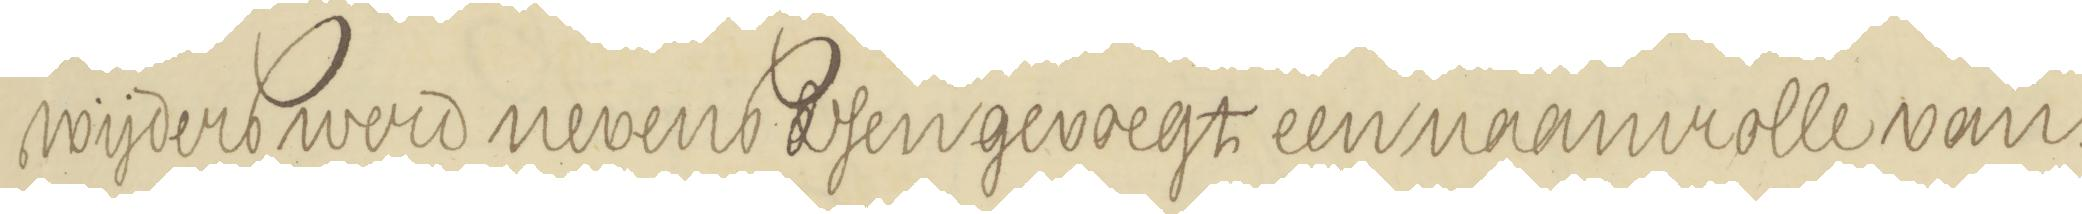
wijders werd nevens desen gevoegt een naamrolle van
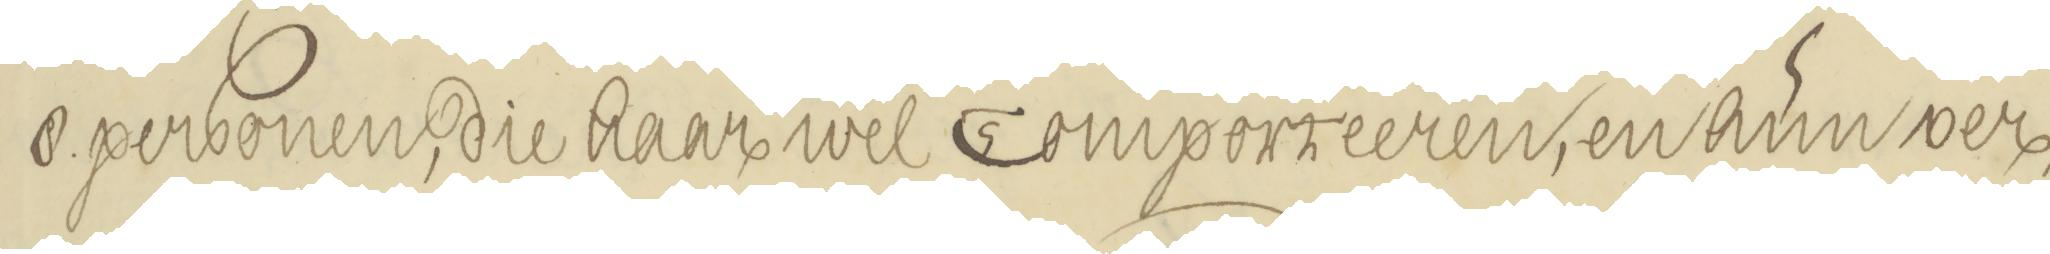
8. personen, die haar wel Comporteeren, en hun ver
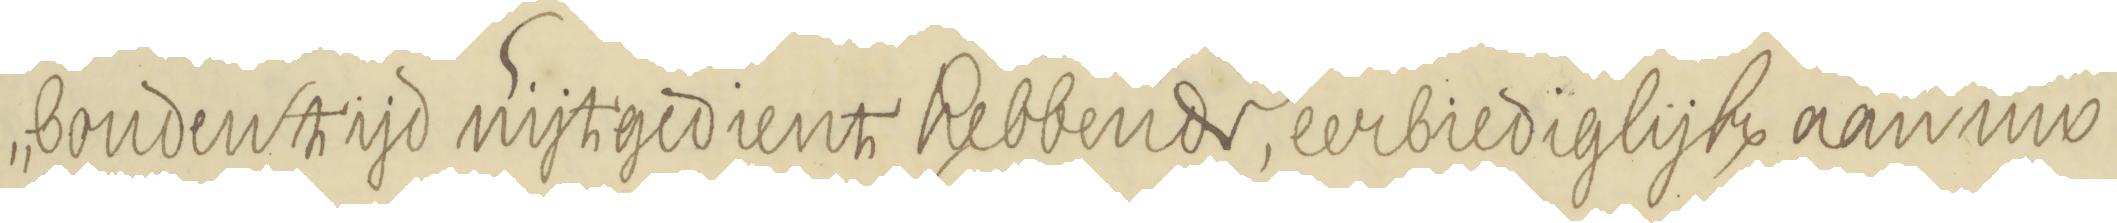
,bonden tijd uijtgedient hebbende, eerbiediglijk aan uw
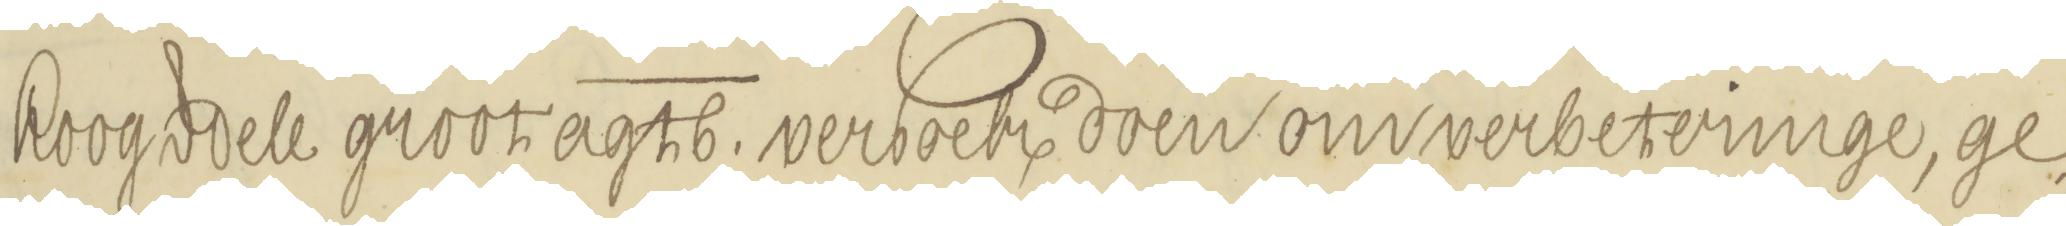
hoog Edele groot agtb. versoek doen om verbeteringe, ge
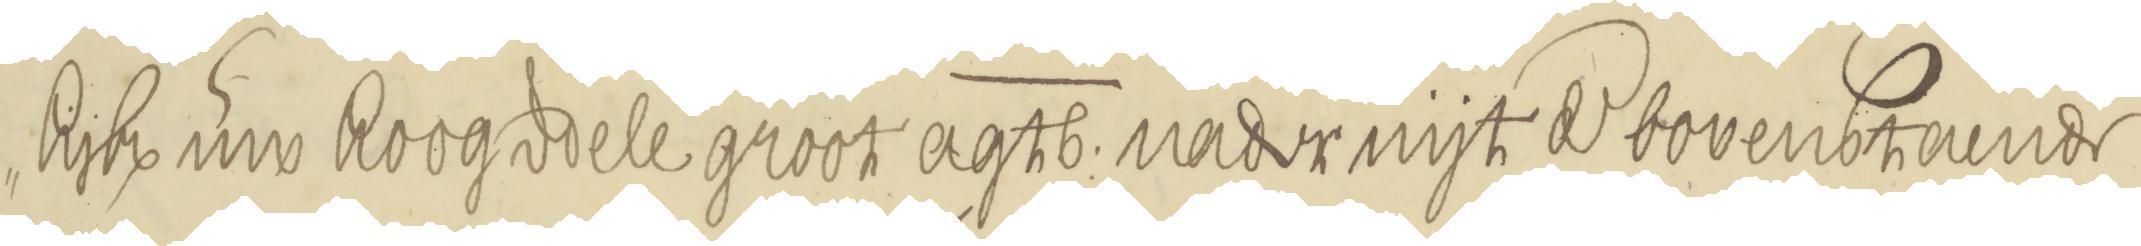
lijk uw hoog Edele groot agtb: nader uijt de bovenstaende
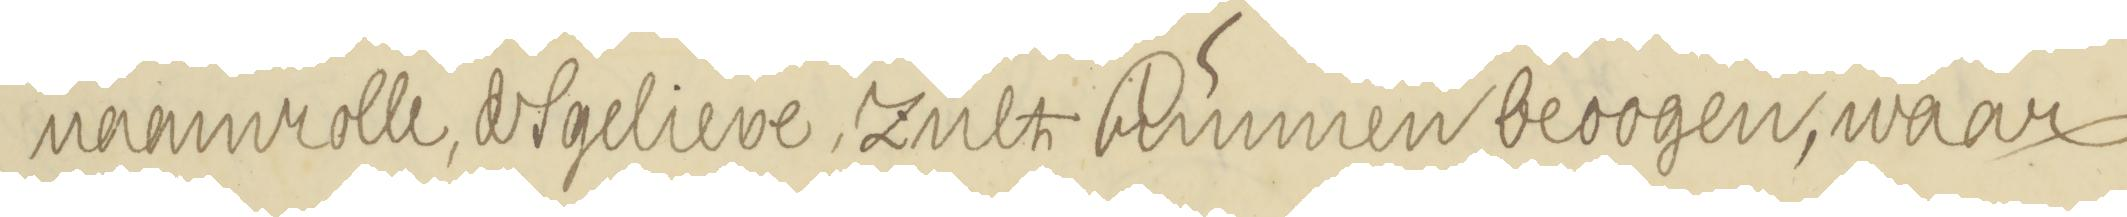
naamrolle, des gelieve, zult kunnen beoogen, waar
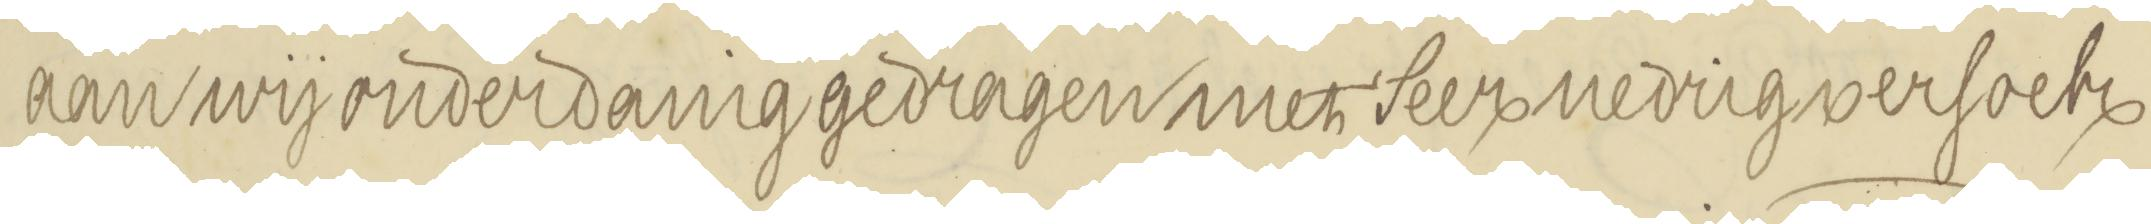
aan wij onderdanig gedragen met seer nedrig versoek
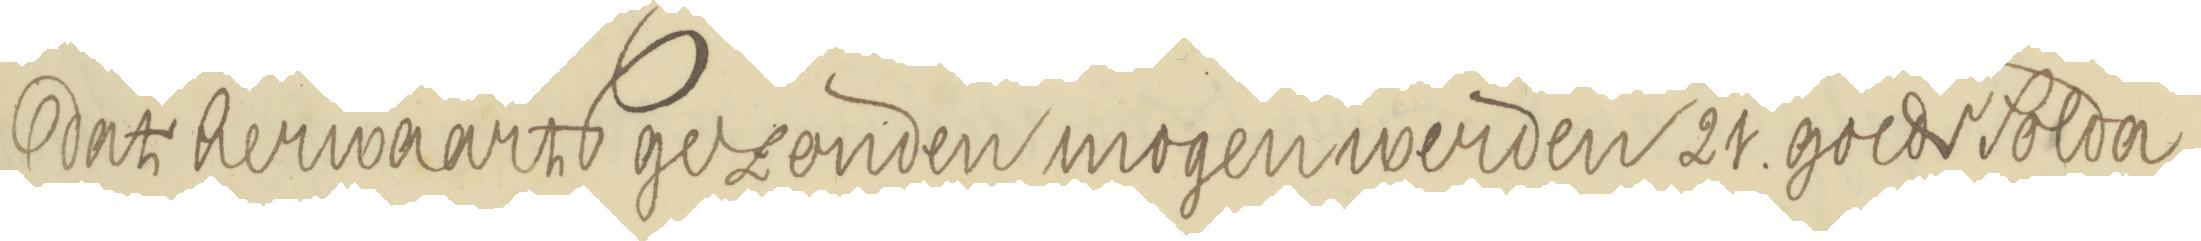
dat herwaarts gezonden mogen werden 21. goede solda
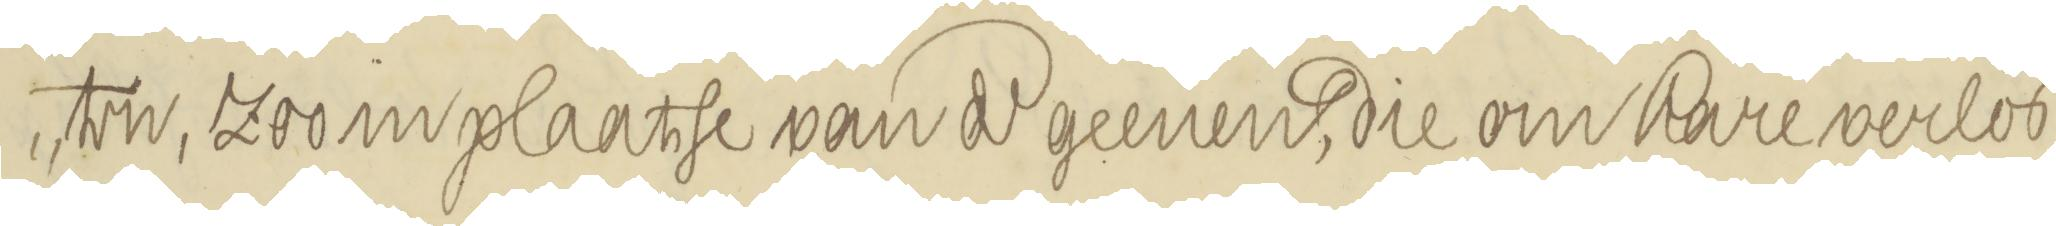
„ten, zoo in plaatse van de geenen, die om hare verlos
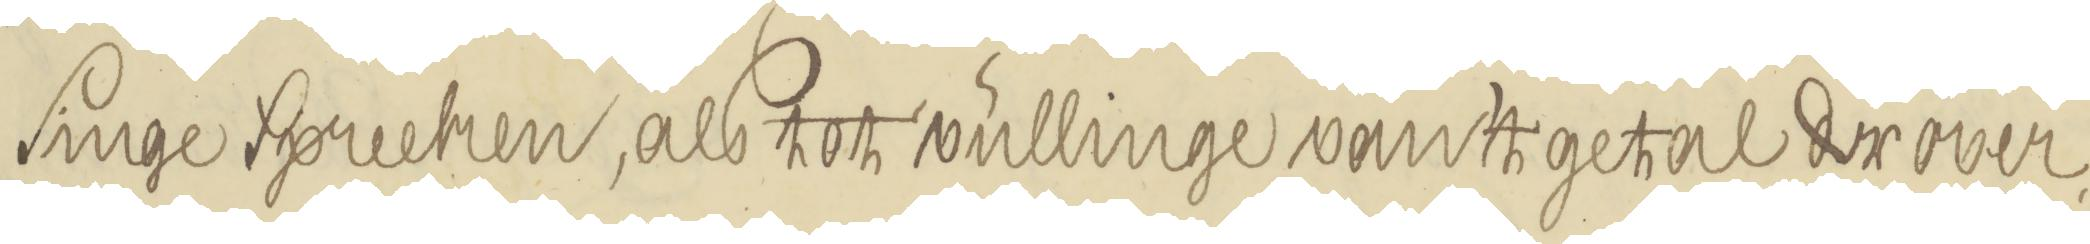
singe spreeken, als tot vullinge van 't getal der over
